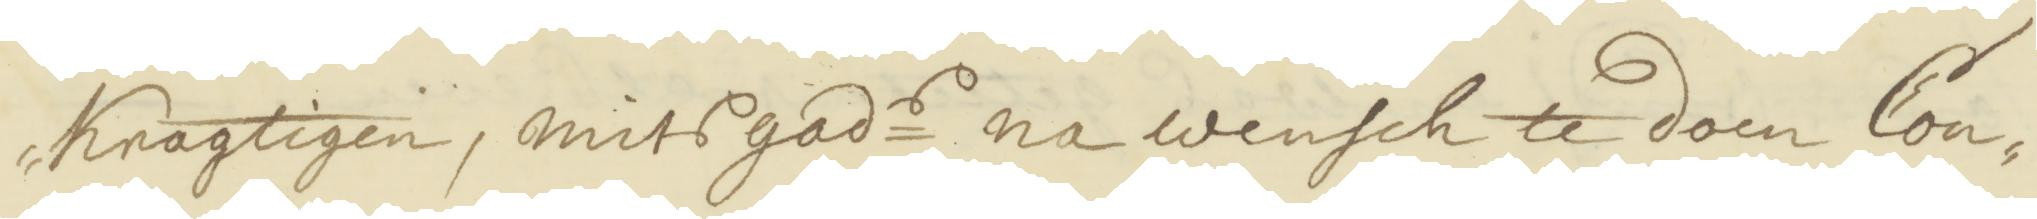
„kragtigen, mitsgad=s na wensch te doen Con„
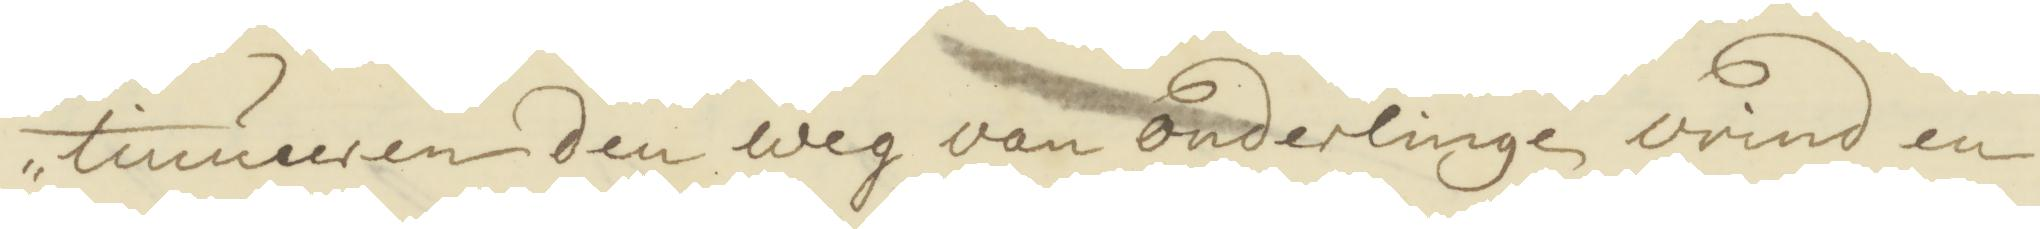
„tinueeren den weg van onderlinge vrind en
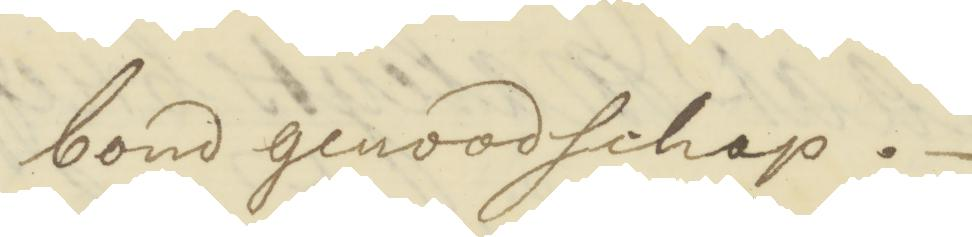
bond genoodschap. —
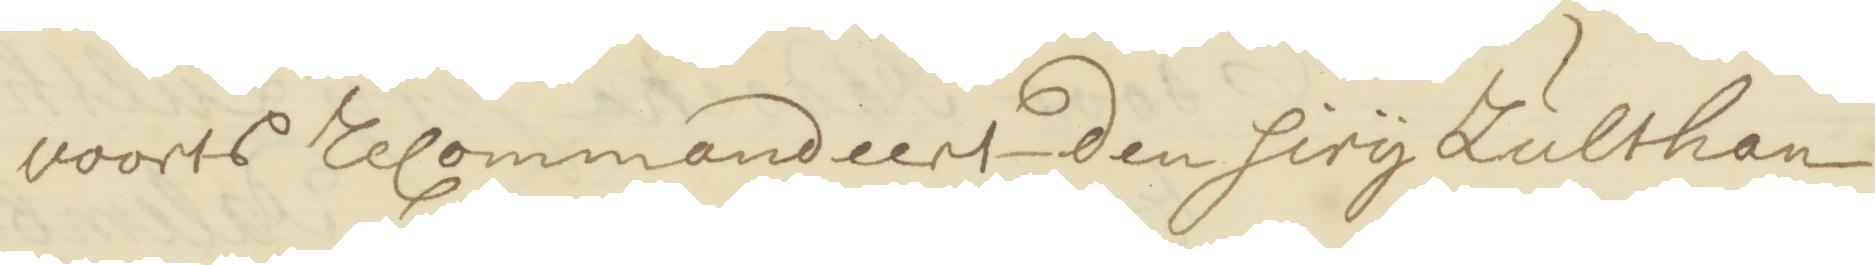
voorts Recommandeert den sirij Zulthan
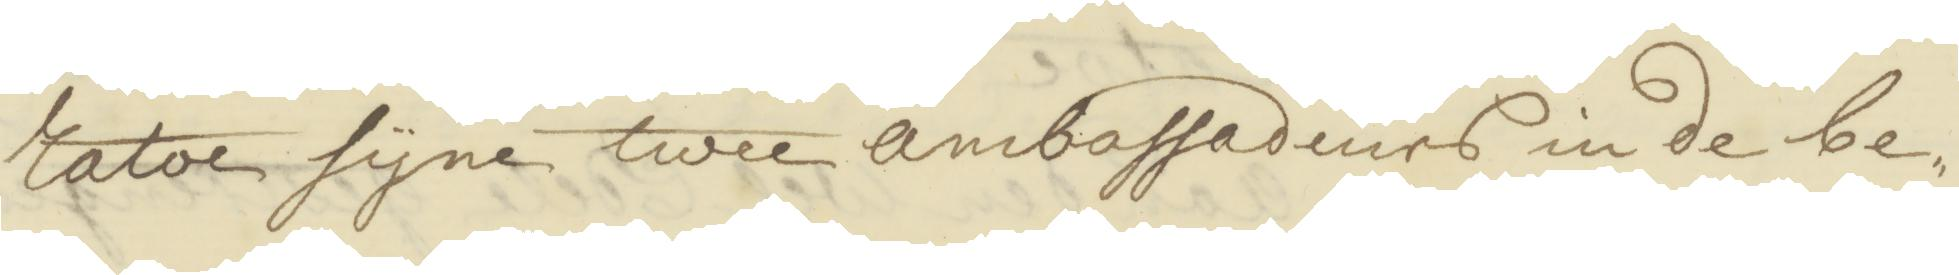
Ratoe sijne twee ambassadeurs in de be„
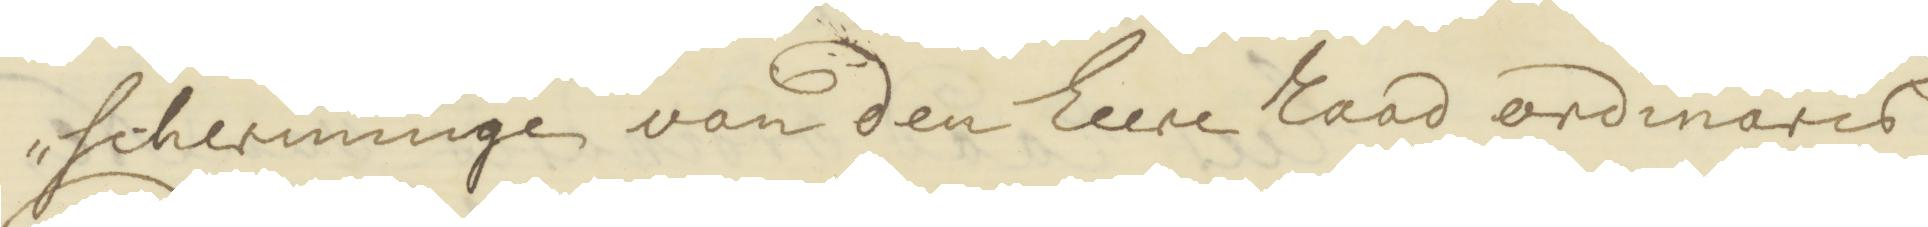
„scherminge van den heere Raad ordinaris
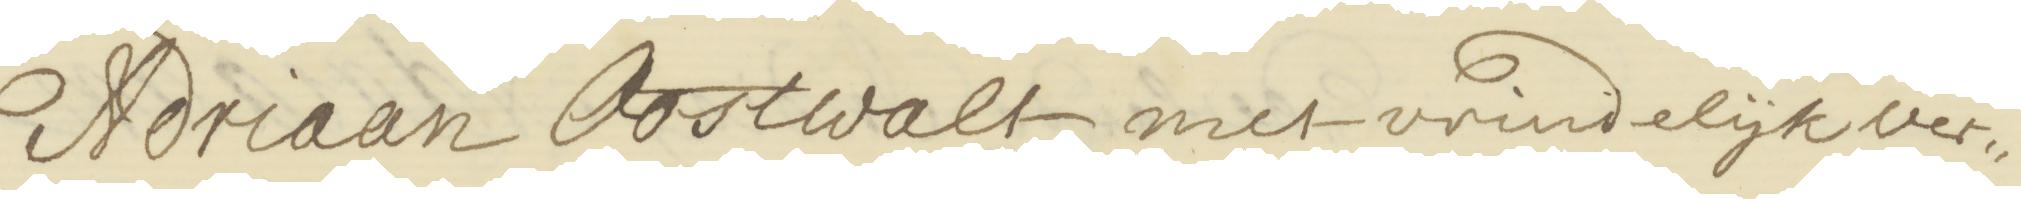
Adriaan Oostwalt, met vrindelijk ver„
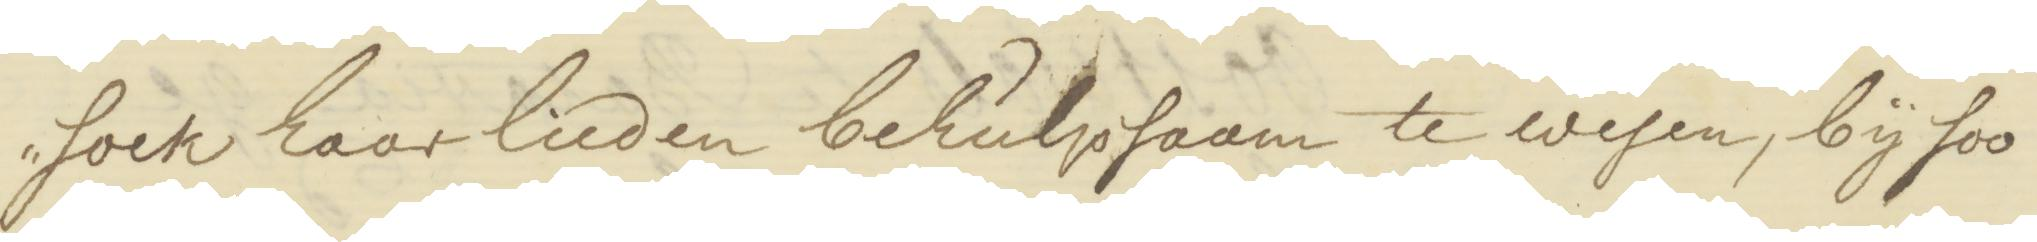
„soek haar lieden behulpsaam te wesen, bij soo
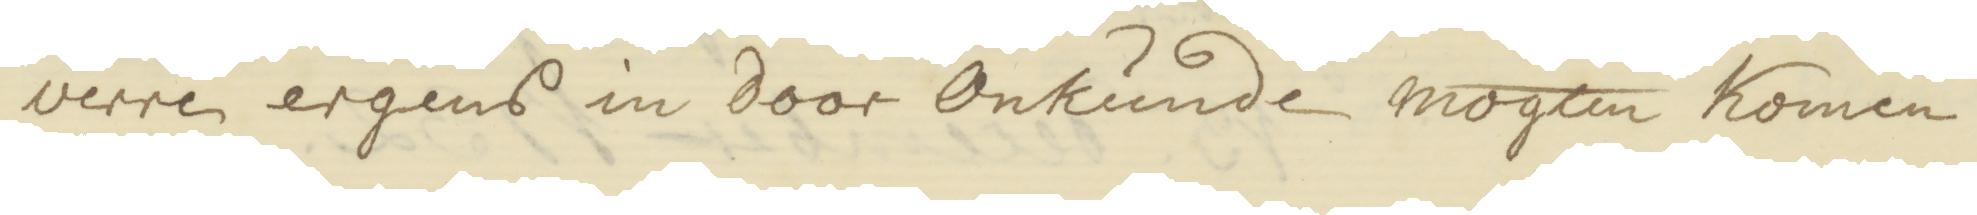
verre ergens in door Onkunde mogten komen
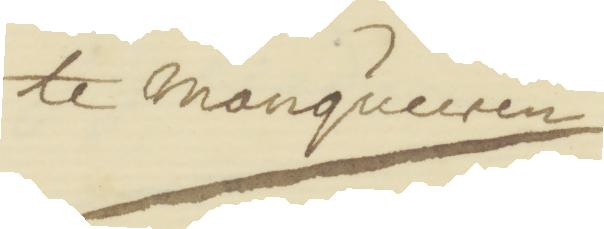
te manqueeren
